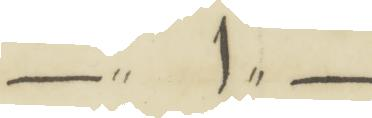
—„ 1„ —
